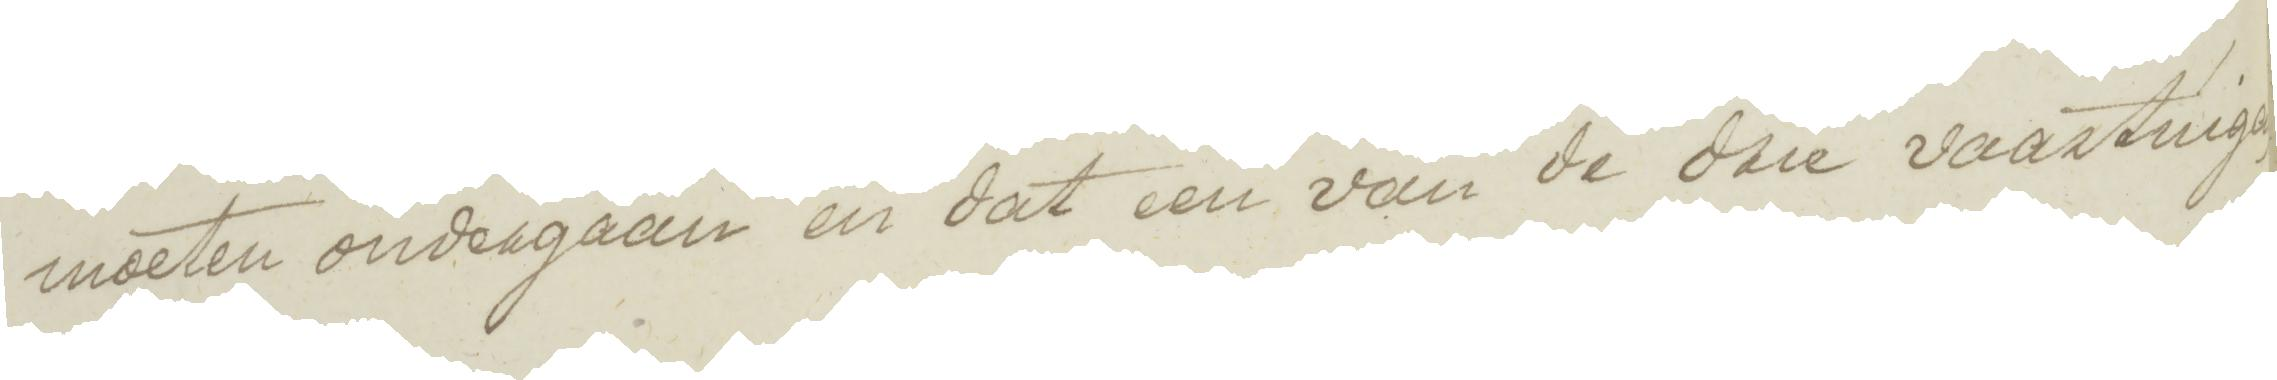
moeten ondergaan en dat een van de drie vaartuig
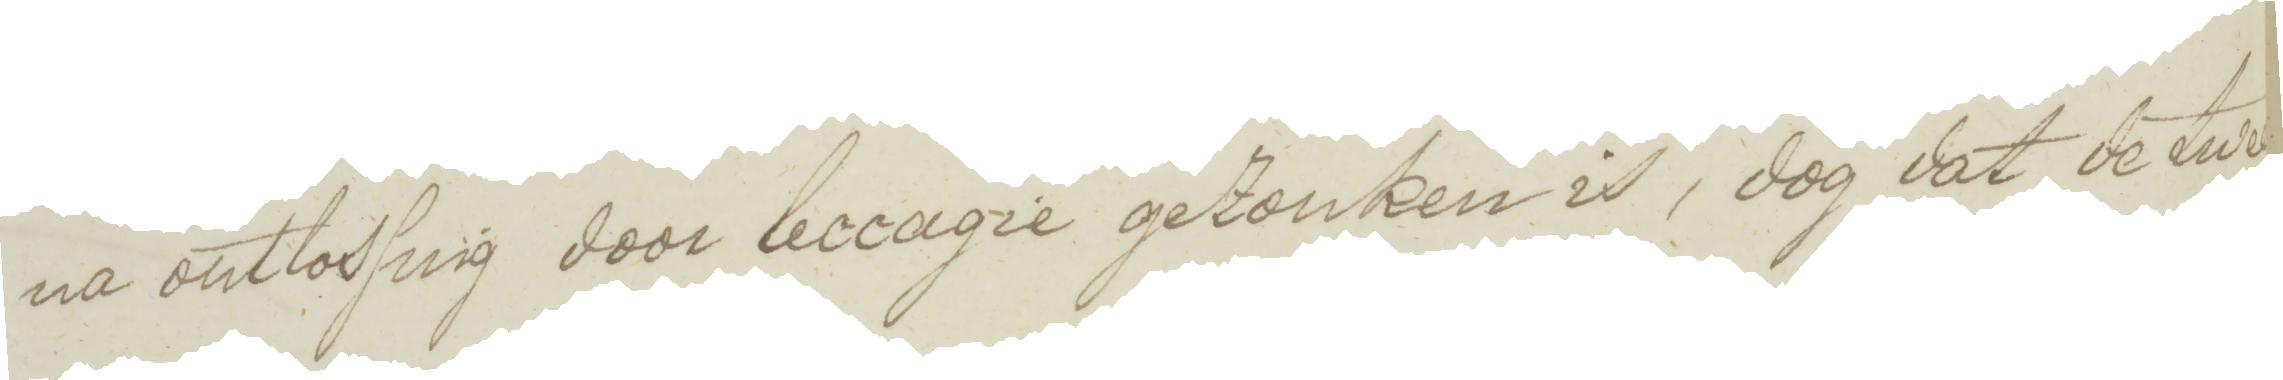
na ontlossing door leccagie gezonken is, dog dat de twe
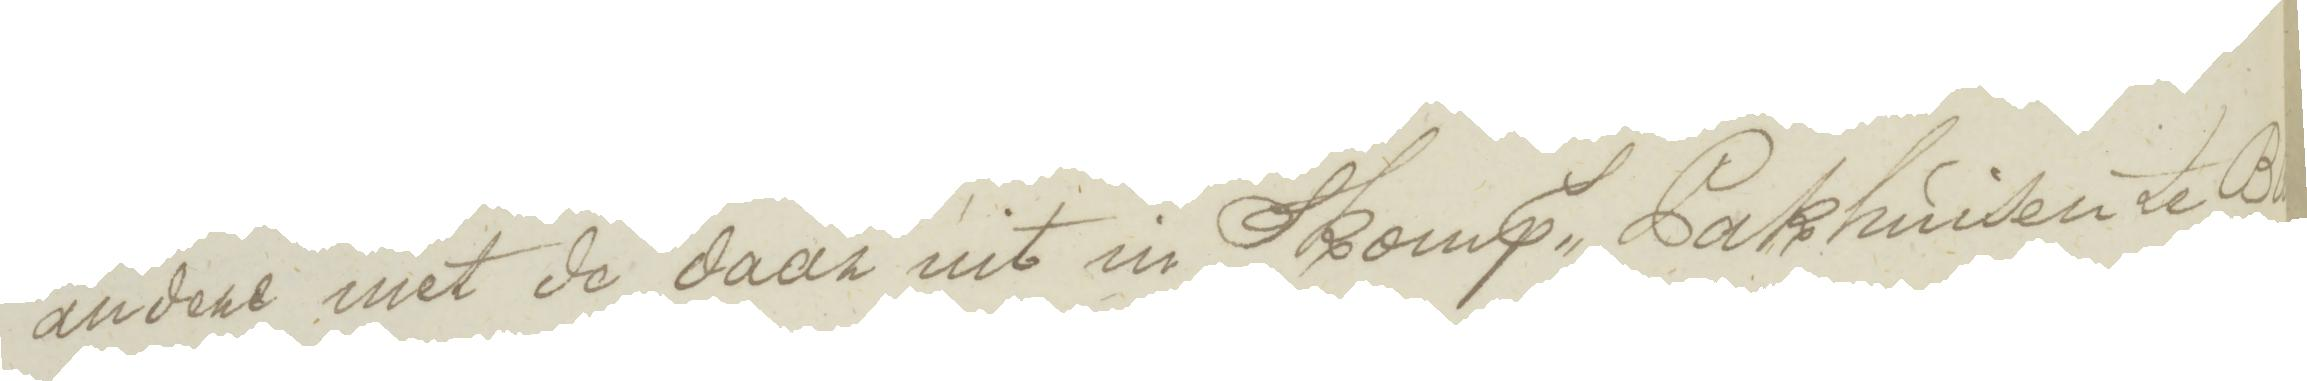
andere met de daar uit in 'skomp„s Pakhuisen te Ba
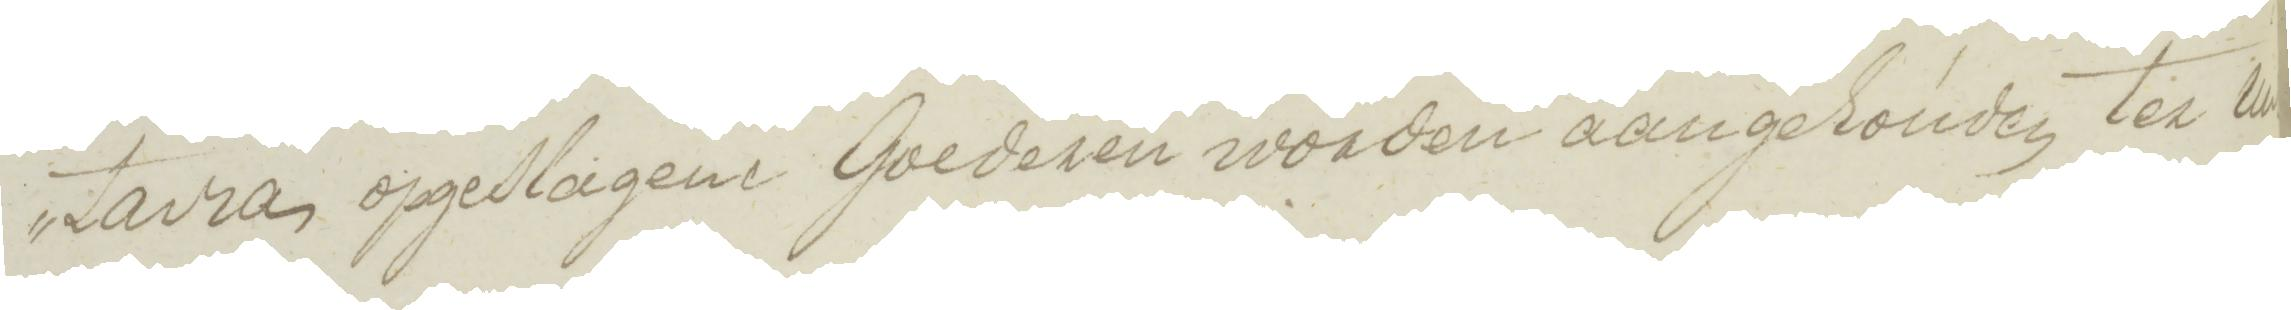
„tavia opgeslagene goederen worden aangehouden ter u
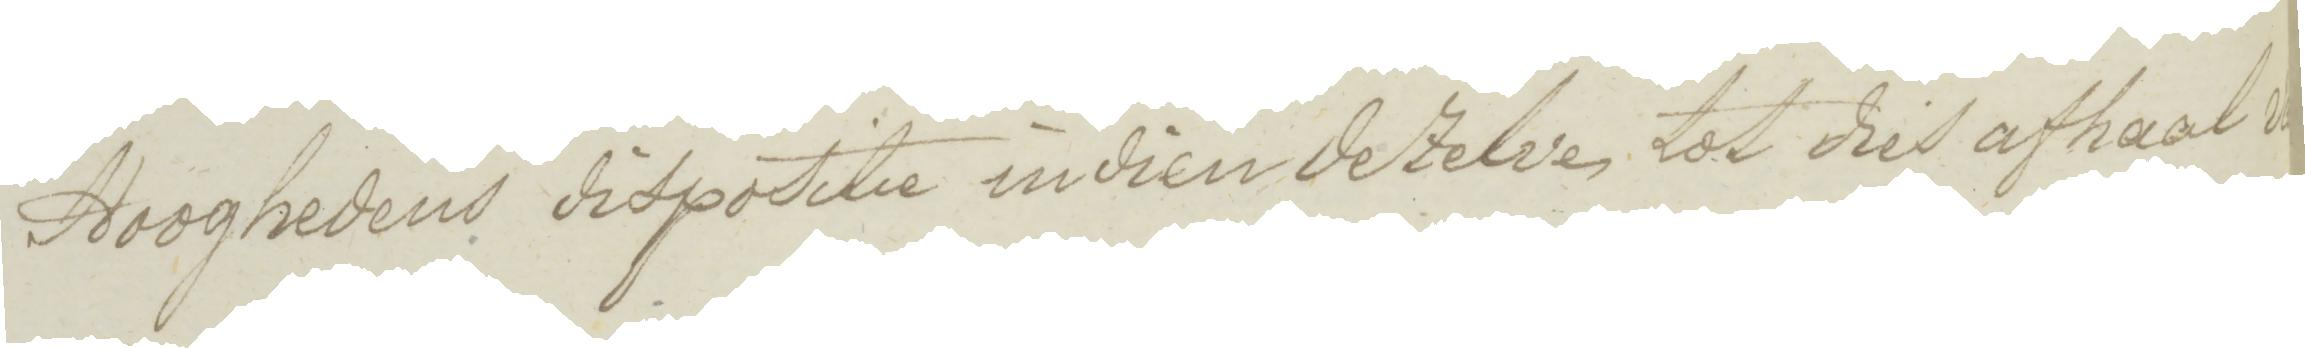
Hooghedens dispositie indien dezelve tot dies afhaal
